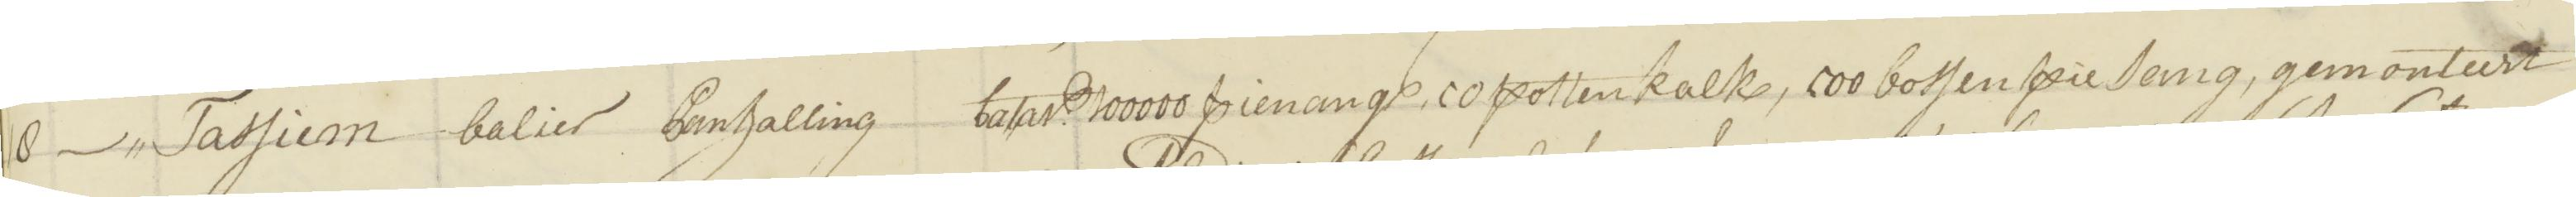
8 _„ Tasjiem balier Pantjalling batav: 100000 pienangs, 50 potten kalk, 500 bossen piesang, gemonteert
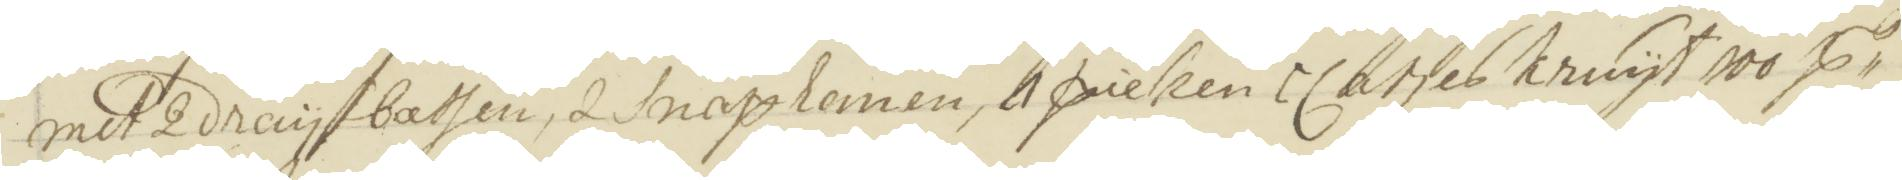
met 2 draijbassen, 2 snaphanen, 4 pieken 5 Catjes kruijt 100 p„s
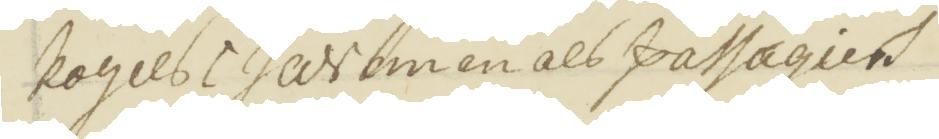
kogels 5 Javanen als passagiers
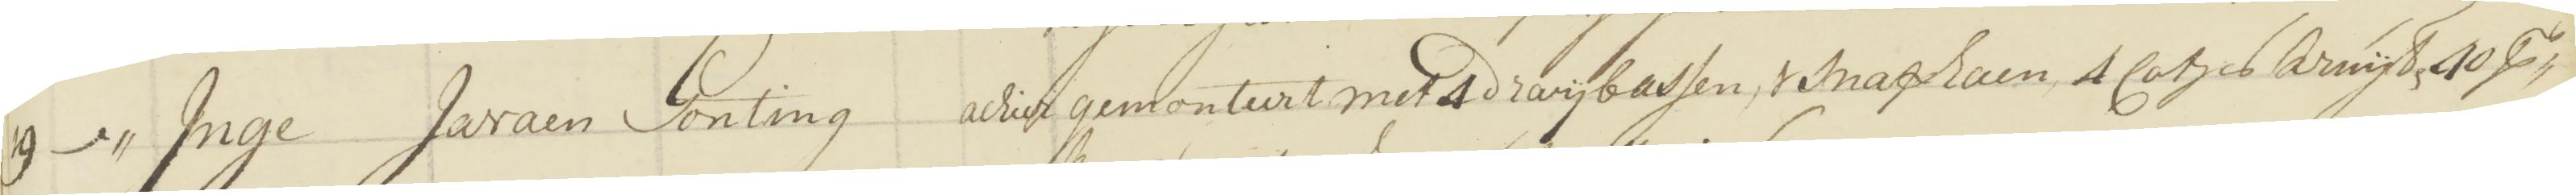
19 _„ Inge Javaen Gonting alhier gemonteert met 4 draijbassen, 1 snaphaen, 4 Catjes kruijt, 40 p„s
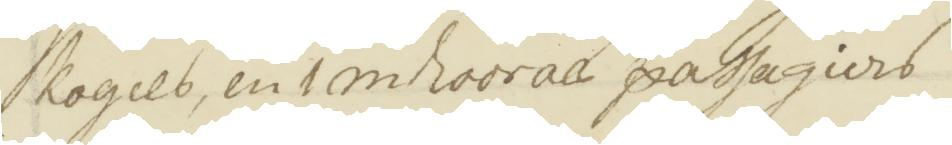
kogels, en 1 mhoor als passagiers
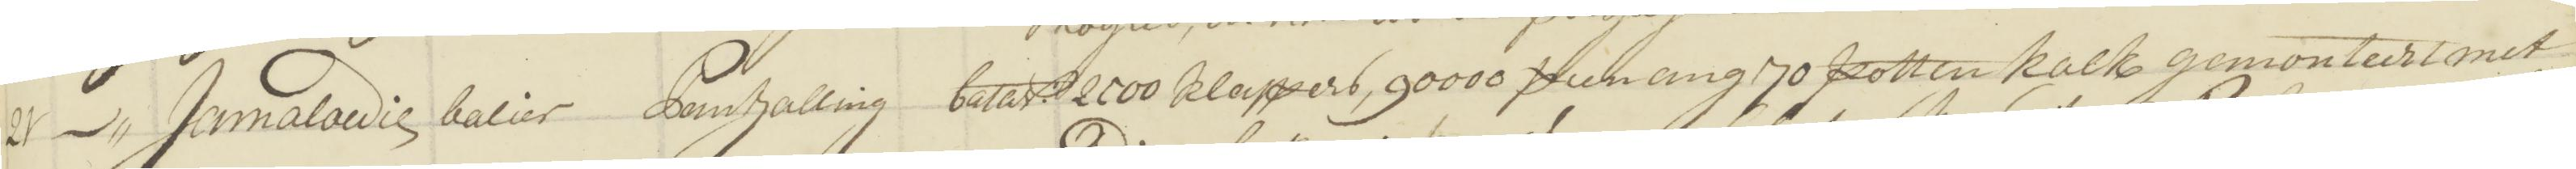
21 _„ Jamaloedien balier Pantjalling batav: 2500 klappers, 90000 pienang 70 potten kalk gemonteert met
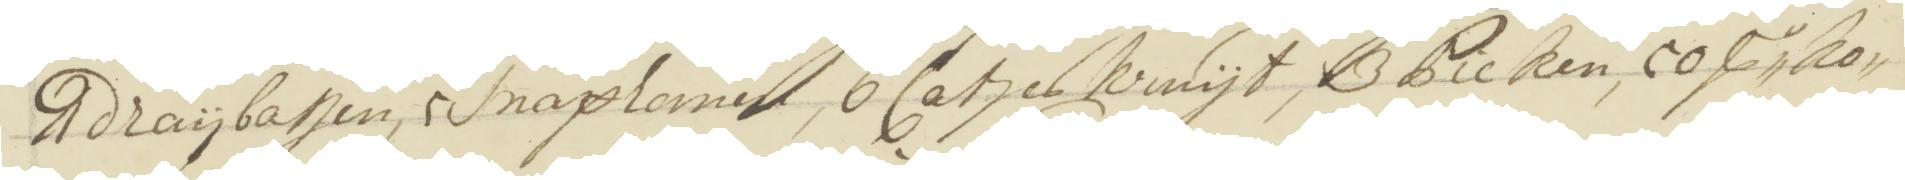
4 draijbassen, 5 Snaphanen, 6 Catjes kruijt, 3 Pieken, 50 p„s ko„
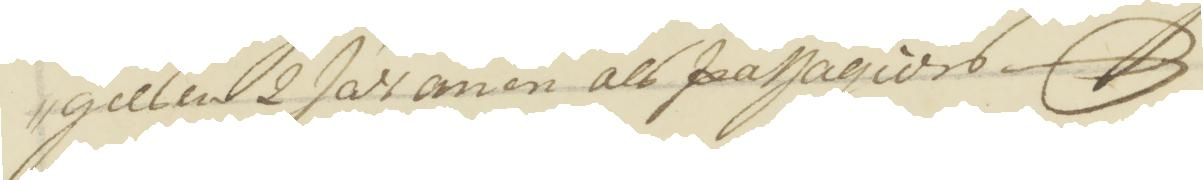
„gels en 2 Javanen als passagiers —
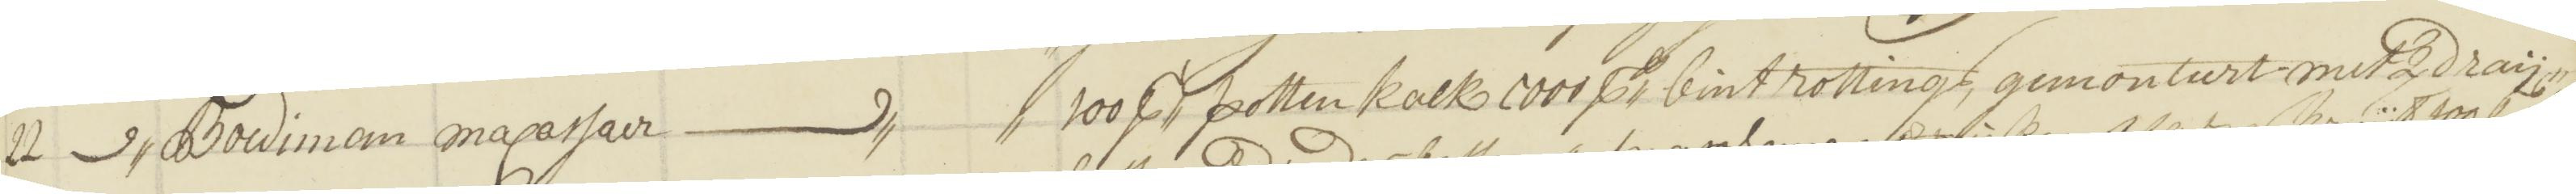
22 _„ Boediman macassaer _„ 100 p„s potten kalk 5000 p„s bintrottings, gemonteert met draij„
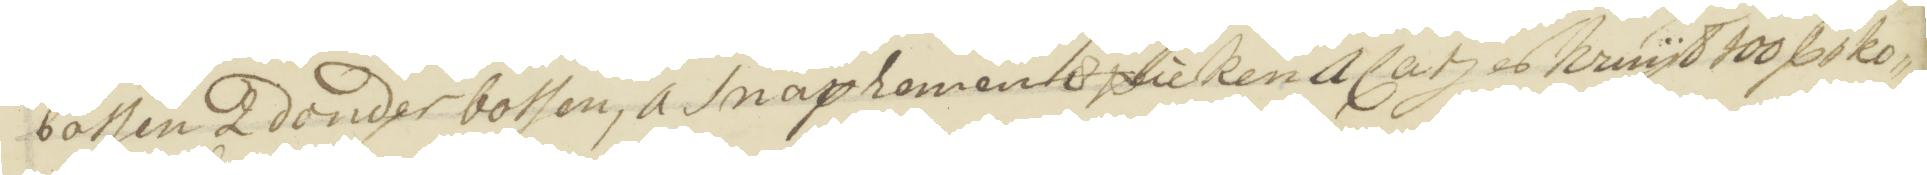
bassen 2 donder bossen, 4 snaphanen 8 pieken 4 Catjes kruijt 100 p„s ko„
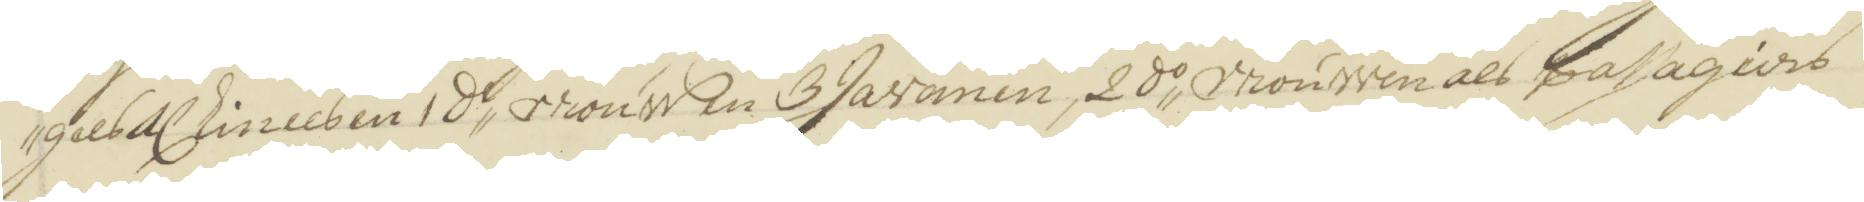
„gels 4 Chineesen 1 d„o vrouw in 3 Javanen, 2 d„o vrouwen als passagiers
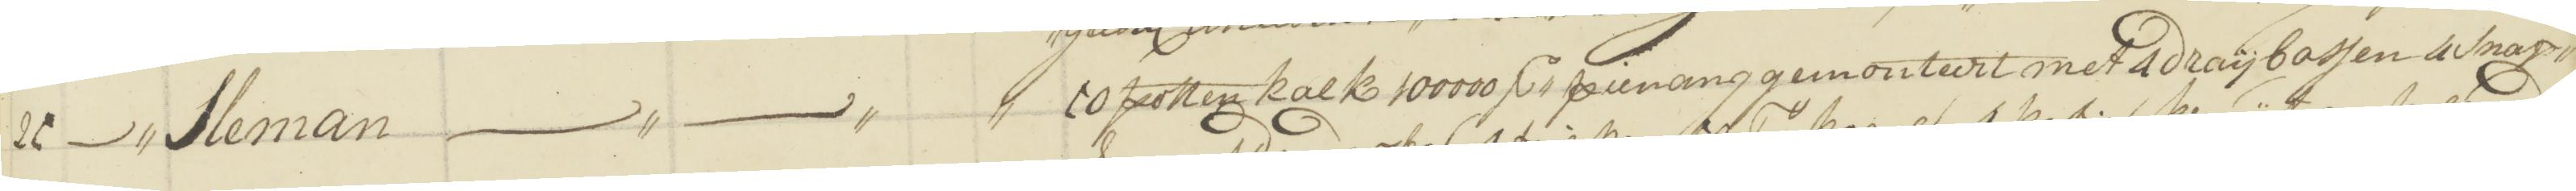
25 _„ Sleman _„ _„ „ 50 potten kalk 100000 p„s pienang gemonteert met 4 draijbassen 4 snap„
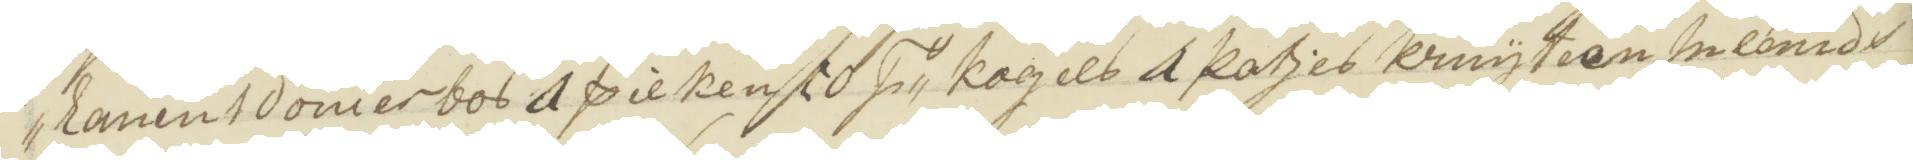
„hanen 1 donderbos 4 pieken 50 p„s kogels 4 katjes kruijt een Inlander
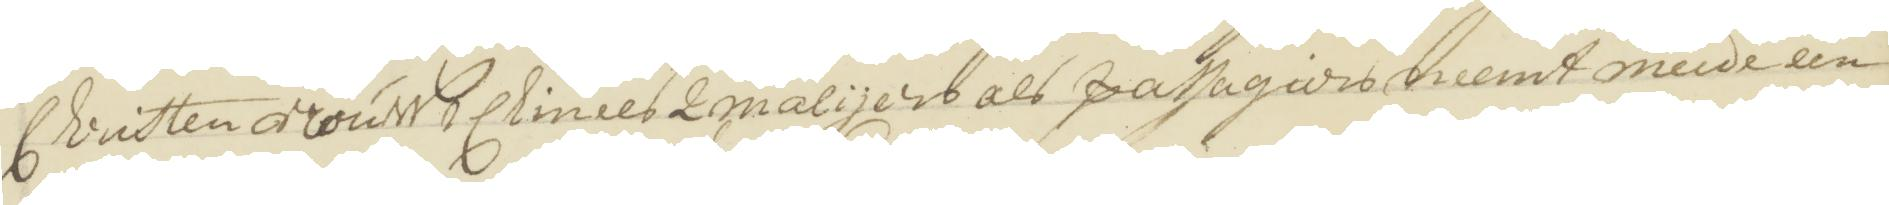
Christen vrouw 1 Chinees 2 malijers als passagiers neemt meede een
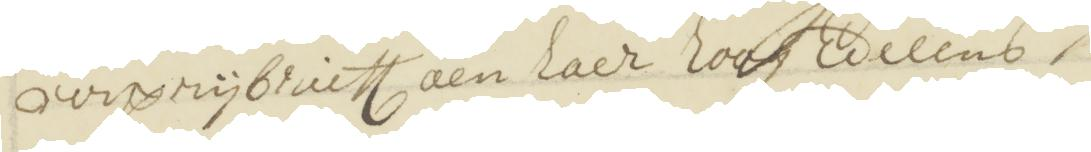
verprijbrieff aen haer hoog Edelens
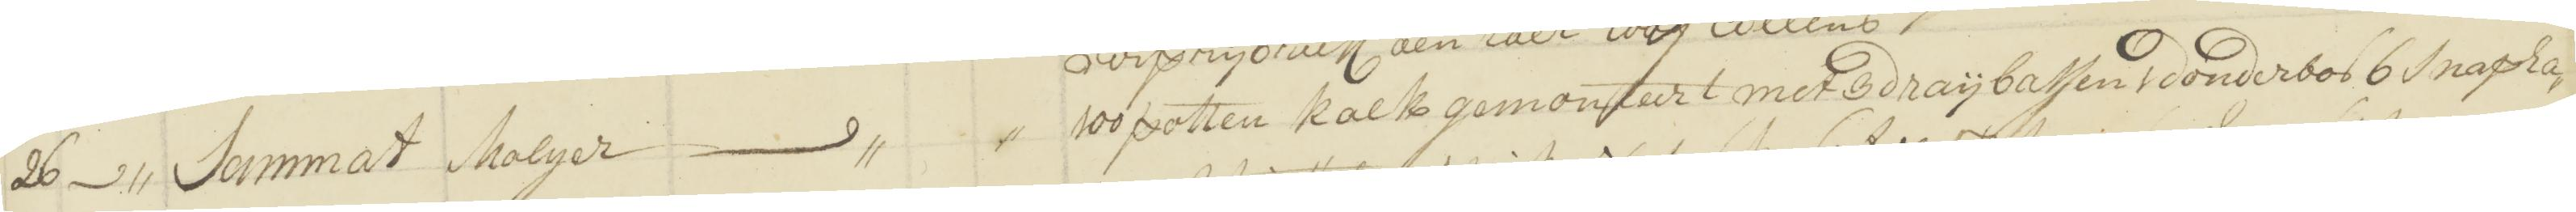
26 _„ Sammat Malyer _„ „ 100 potten kalk gemonteert met 3 draijbassen 1 donderbos 6 snapha„
